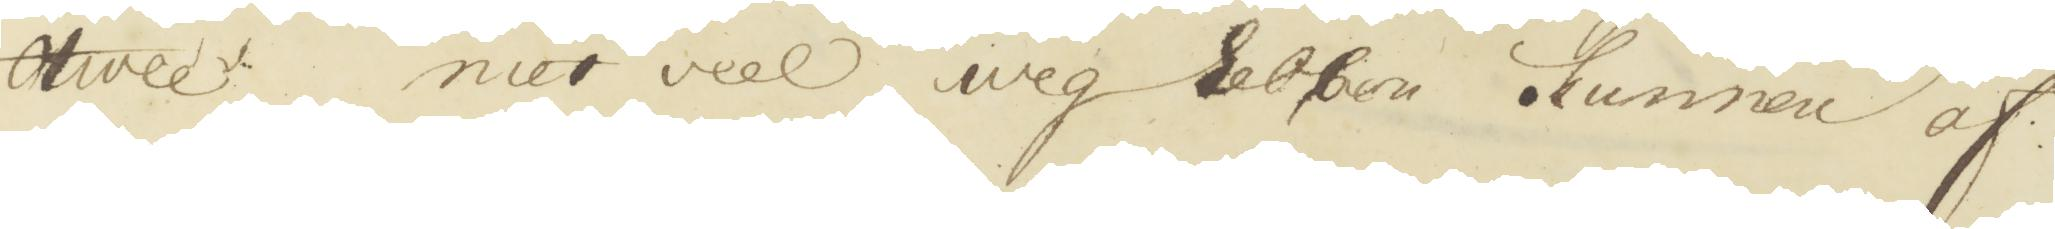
twee niet veel weg hebben kunnen af:
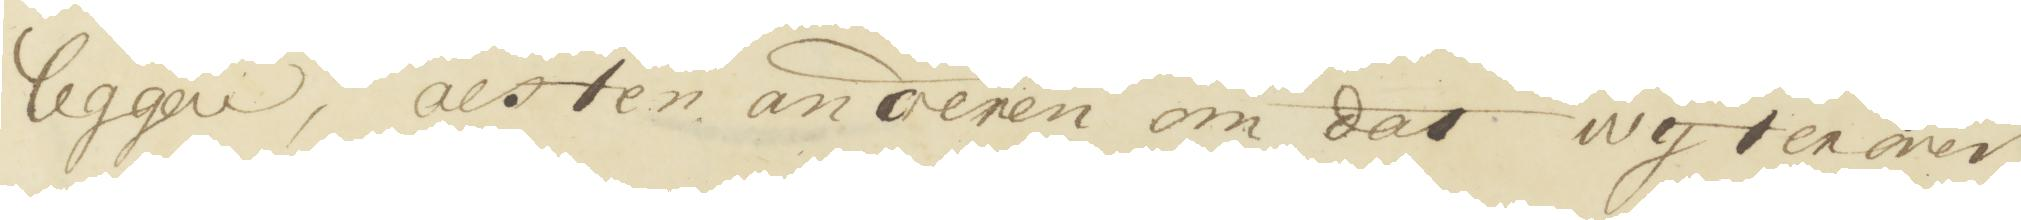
leggen, als ten anderen om dat wy ter over
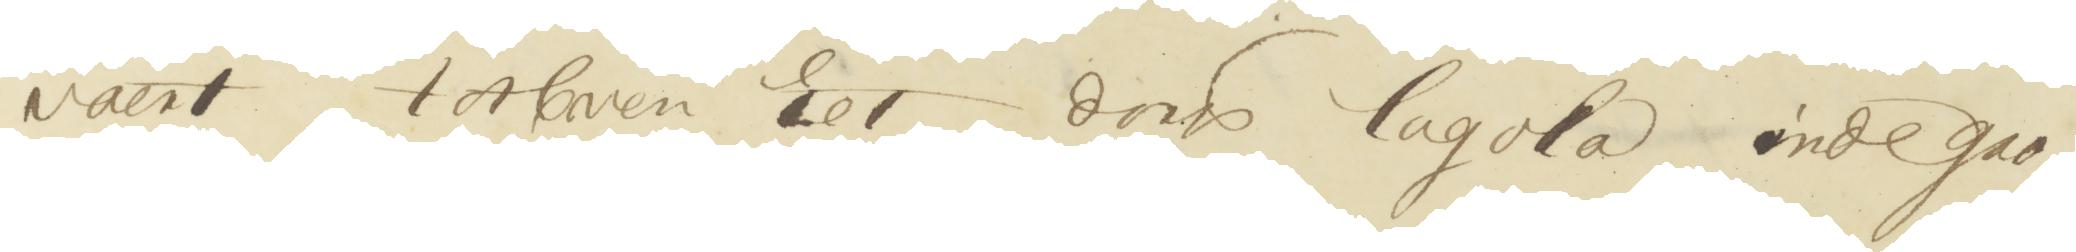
vaert tot boven het dorp lagola in de gro
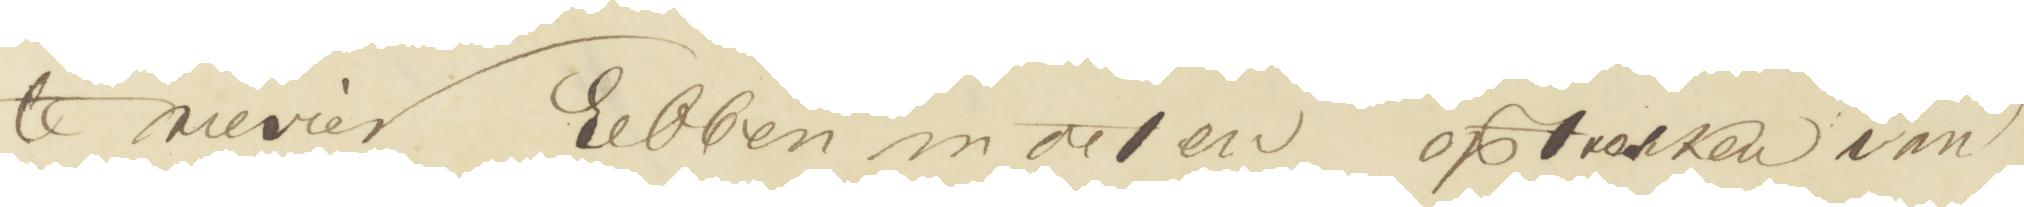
te rievier hebben moeten op trekken van
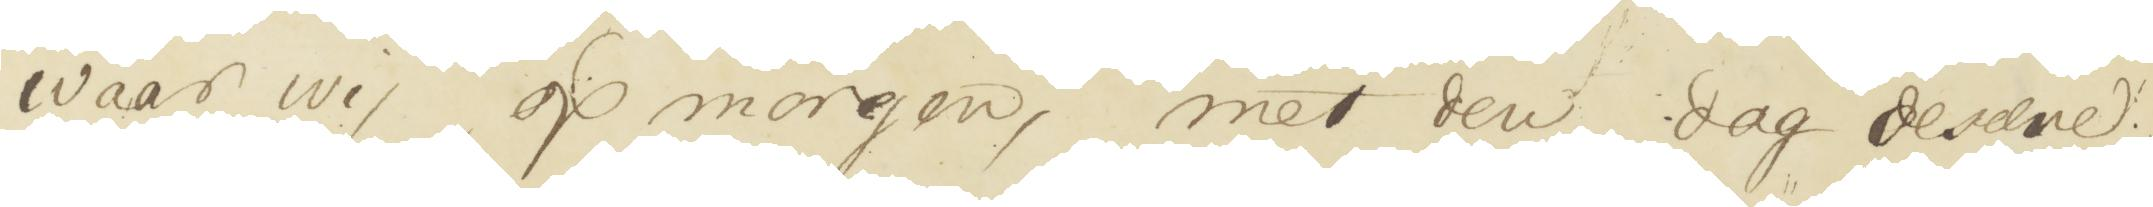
waar wij op morgen, met den dag deselve
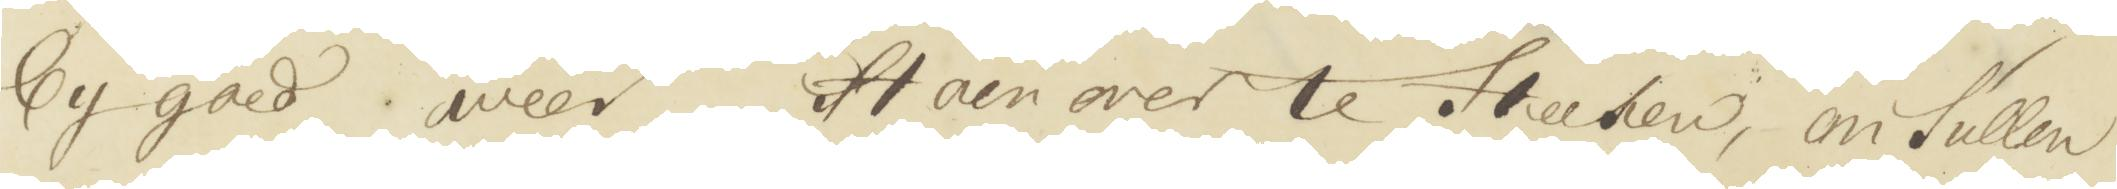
by goed weer staen over te Steeken, en Sullen
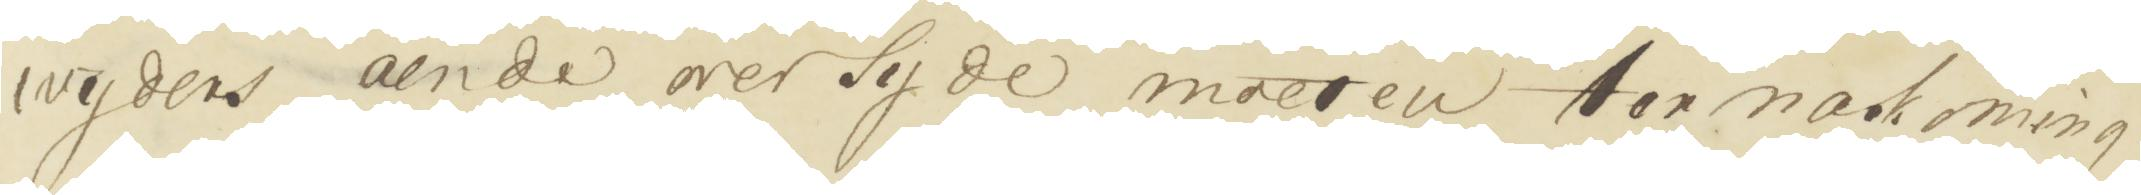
wijders aen de oversyde moeten ter nakoming
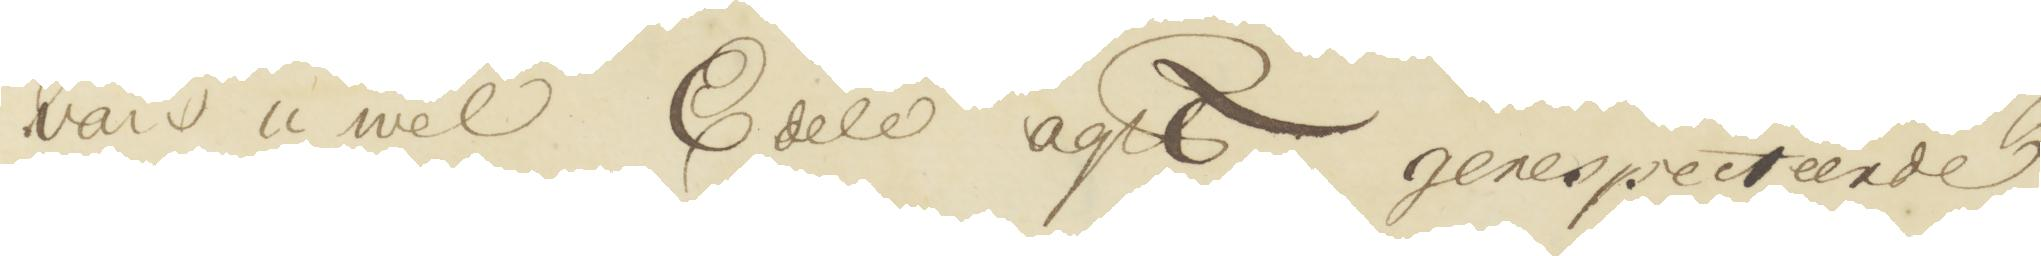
van u wel Edele agtb: gerespecteerde
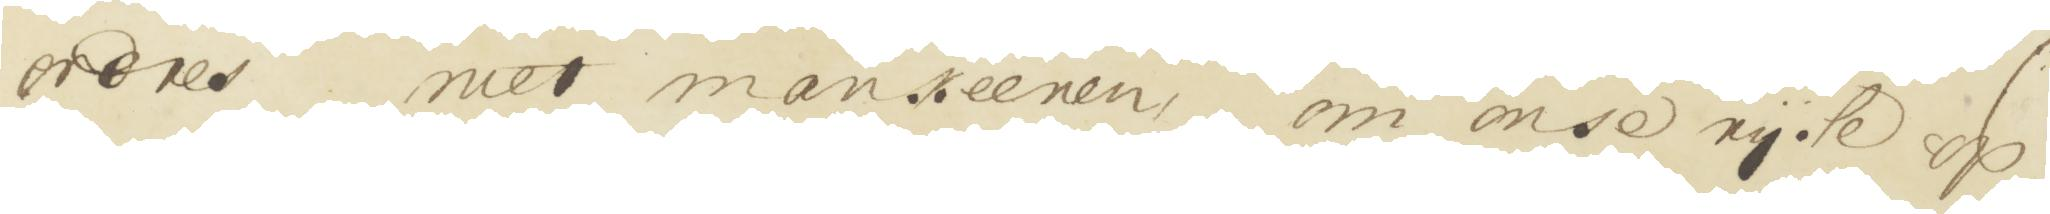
ordres niet mankeeren, om onse rijse op
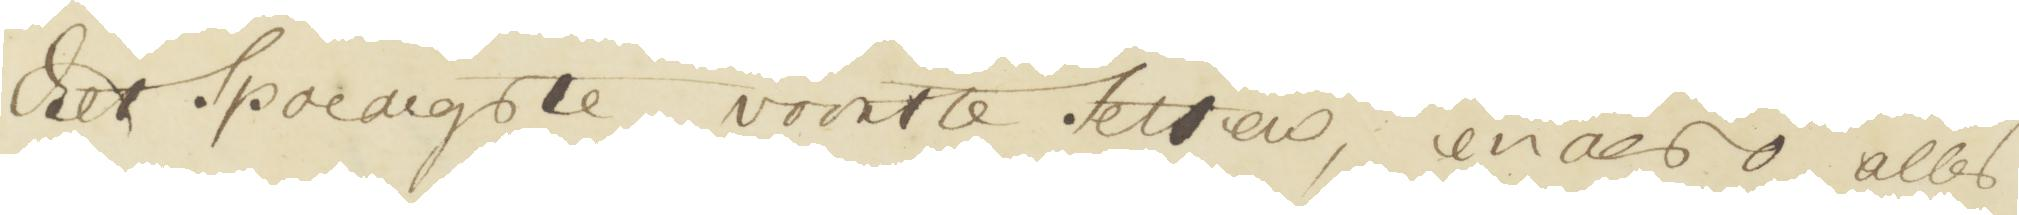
het Spoedigste voor te setten, en also alles
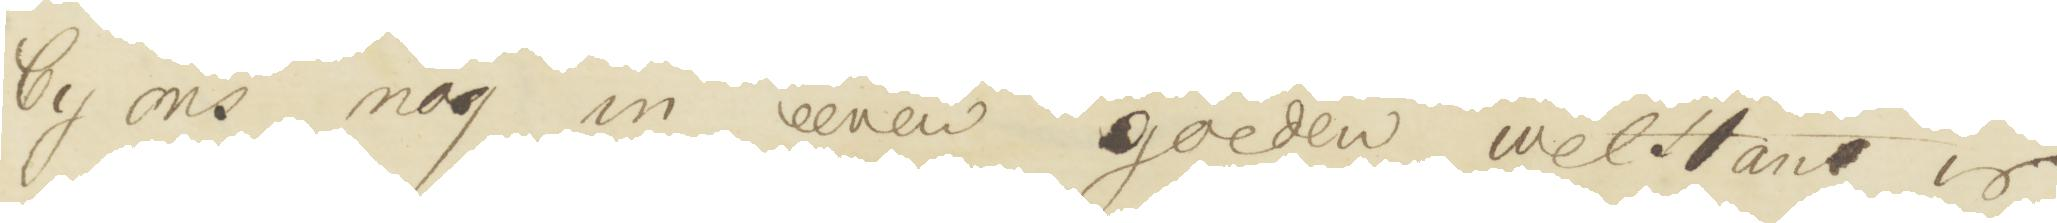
by ons nog in eenen goeden welstant is
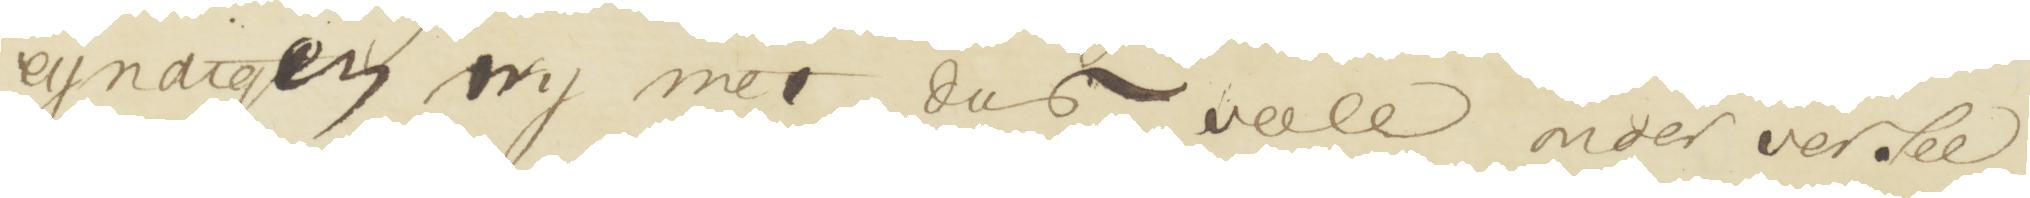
eyndigen wy met dus veele onder versee
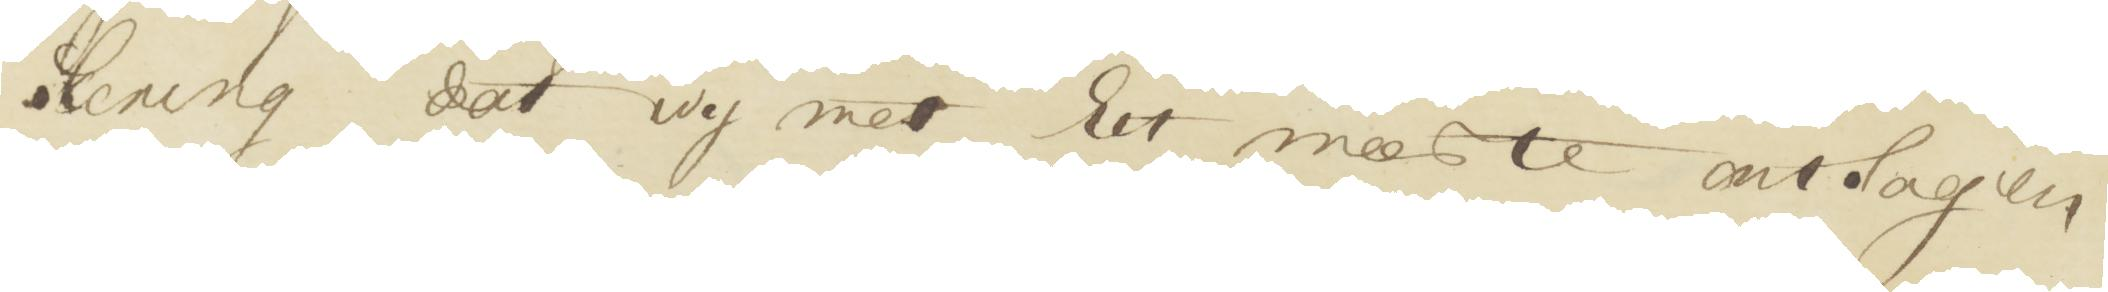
kering dat wy met het meeste ontsag en
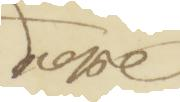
diepe
